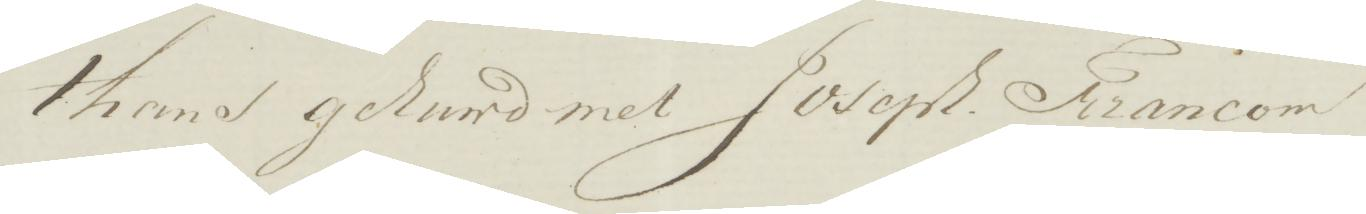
thans gehuwd met Joseph Francom
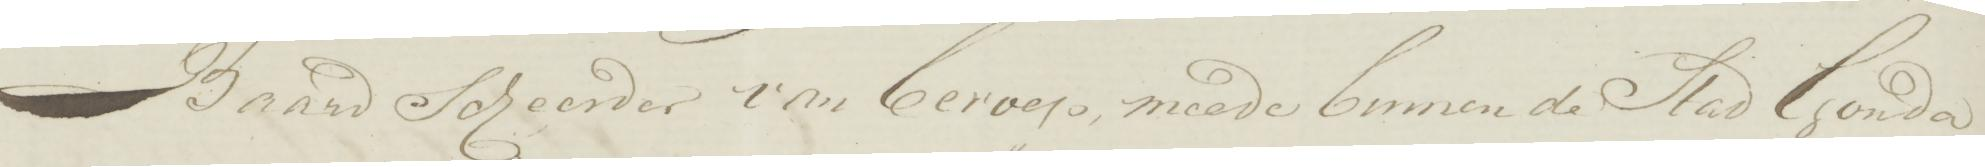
Baard Scheerder van beroep, meede binnen de Stad Gouda,
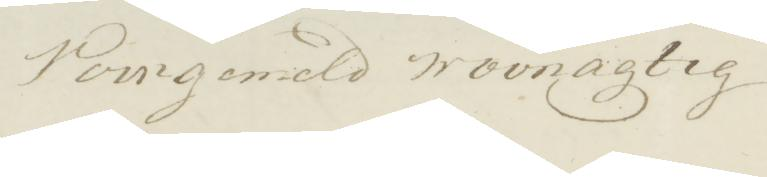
Voorgemeld woonagtig
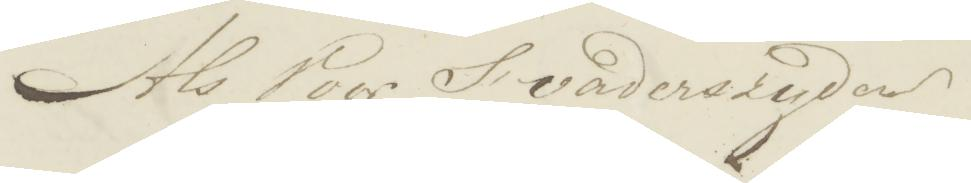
Als Voor S'vaderszyden
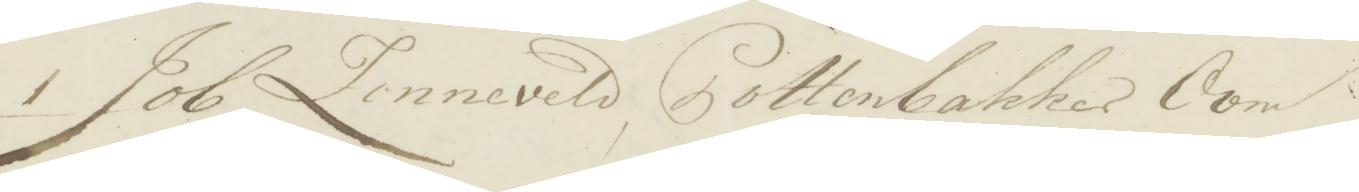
1 Job Zonneveld, Pottenbakker Oom
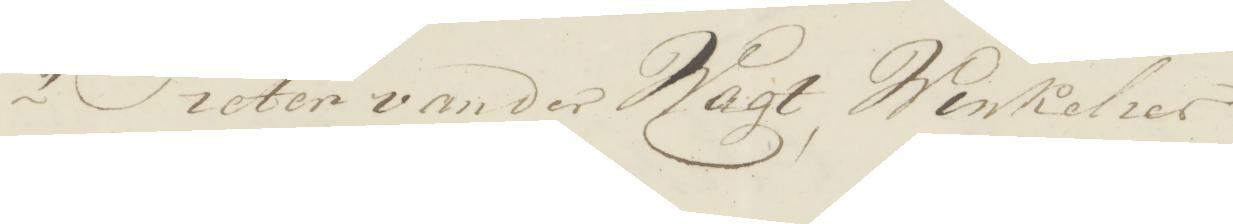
2 Pieter van der Wagt, Winkelier
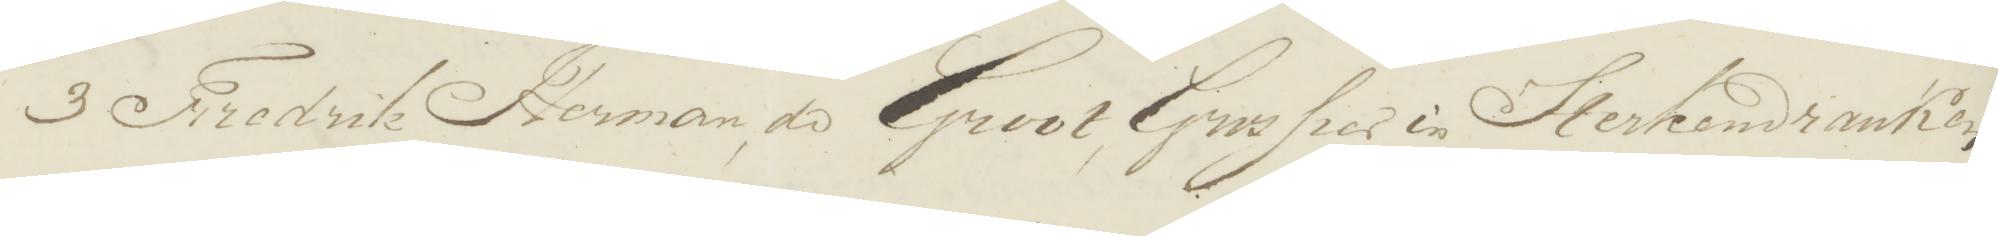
3 Fredrik Herman, de Groot, Grossier in Sterkendranken
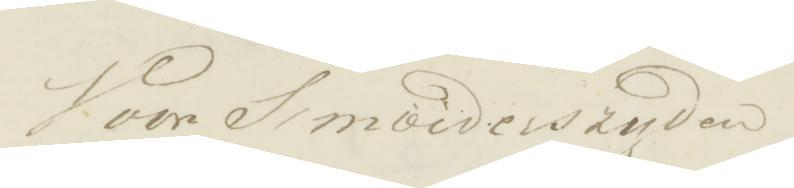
Voor S'moeders zyden
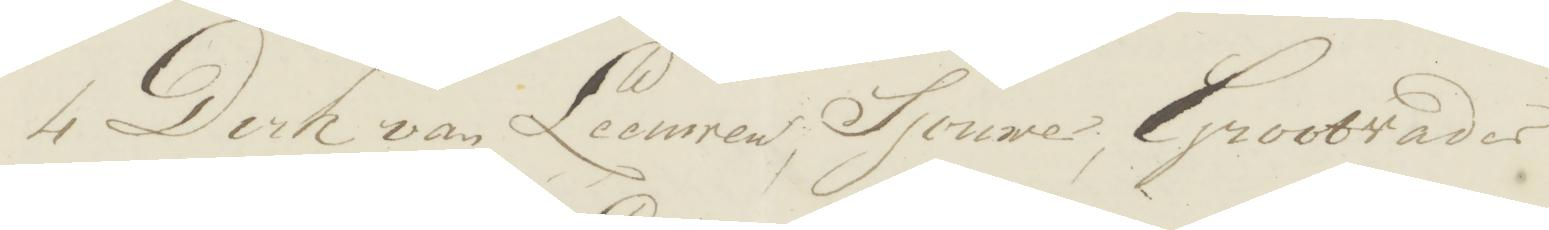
4 Dirk van Leeuwen, Sjouwer, Grootvader
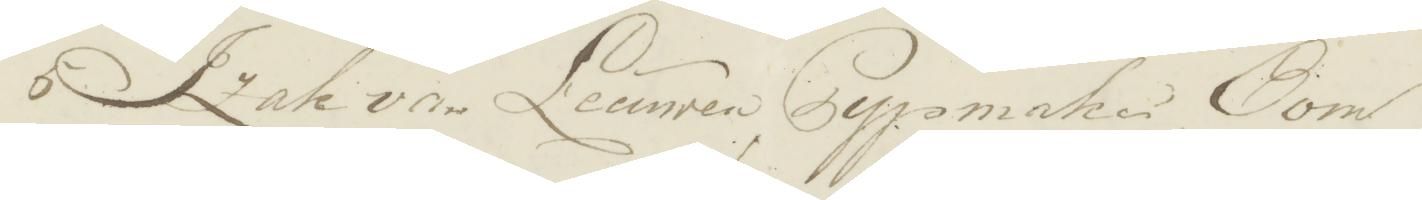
5 Izak van Leeuwen, Pypmaker, Oom
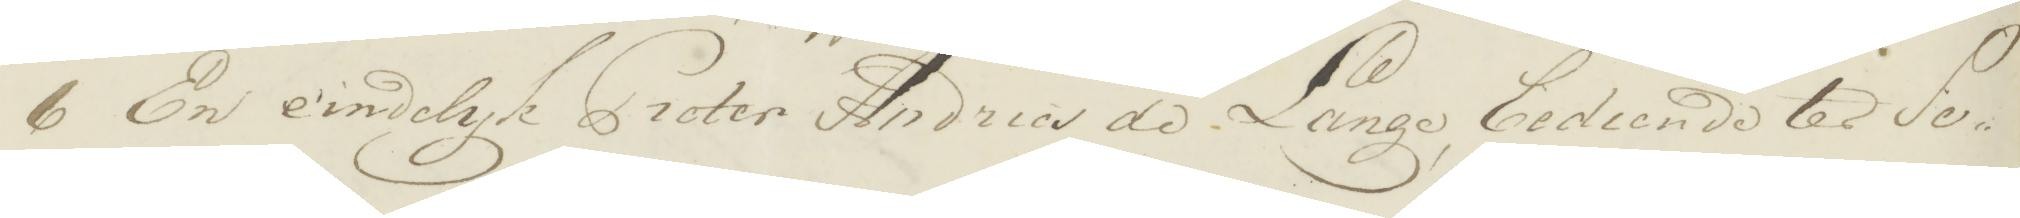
6 En eindelyk Pieter Andries de Lange, bediende ter Se„
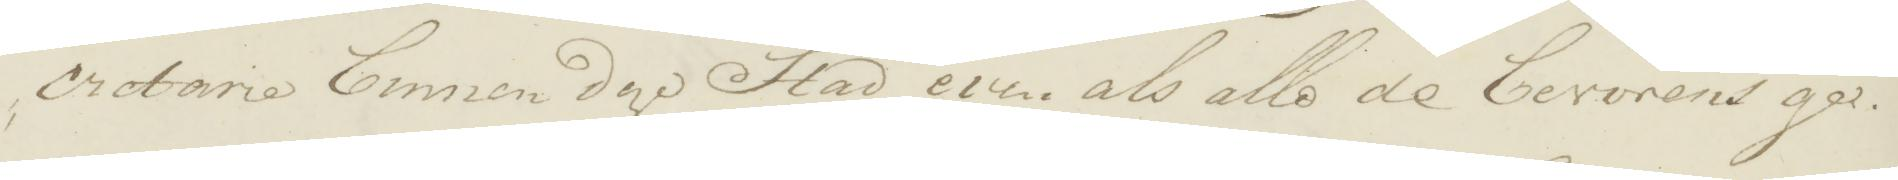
„cretarie binnen deze Stad, even als alle de bevorens ge„
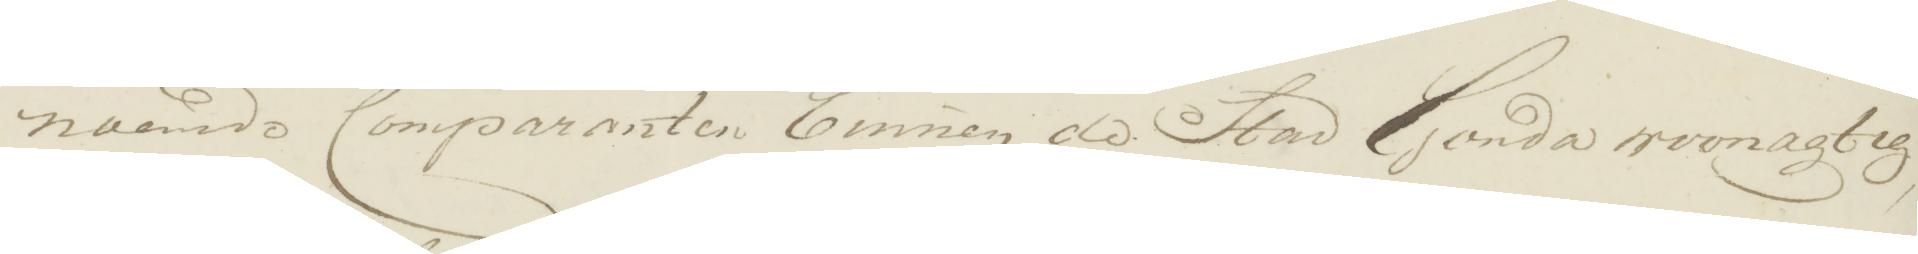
noemde Comparanten binnen de Stad Gouda woonagtig,
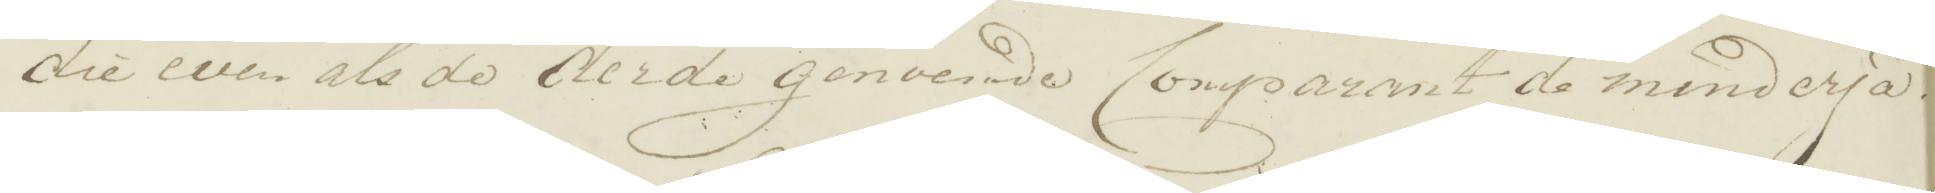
die even als de derde genoemde Comparant de minderja
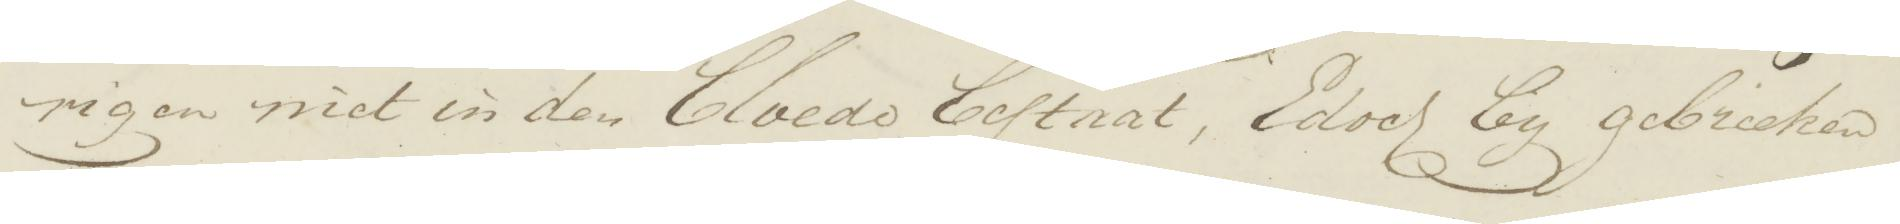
rigen niet in den bloede bestaat, Edoch by gebreeken
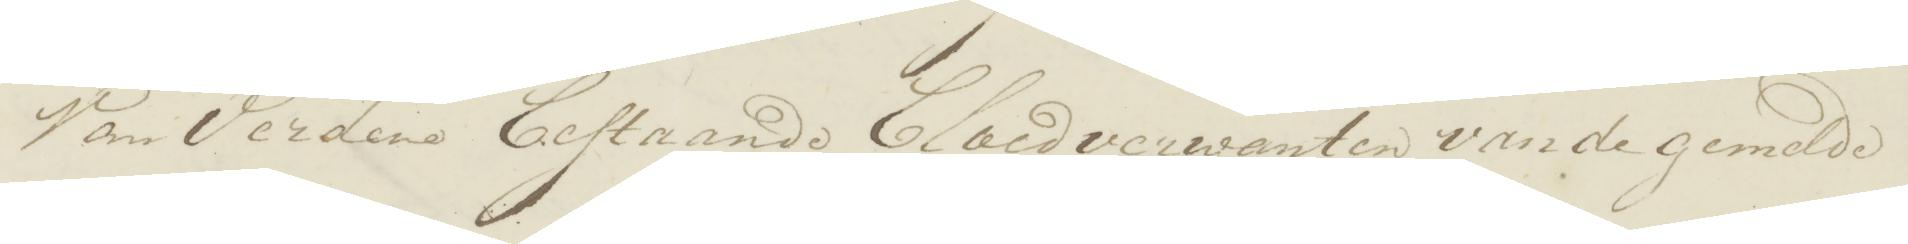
Van Verdere bestaande bloed verwanten van de gemelde
